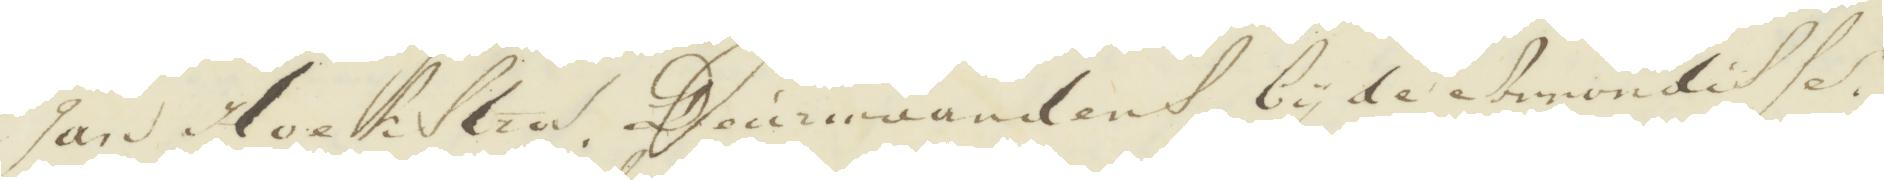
Jan Hoekstra, Deurwaarders, bij de Arrondisse.
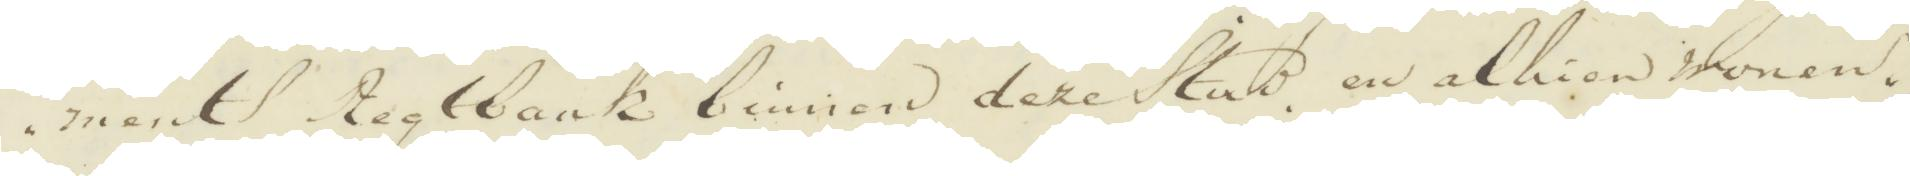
„ments Regtbank binnen deze Stad, en alhier wonen„
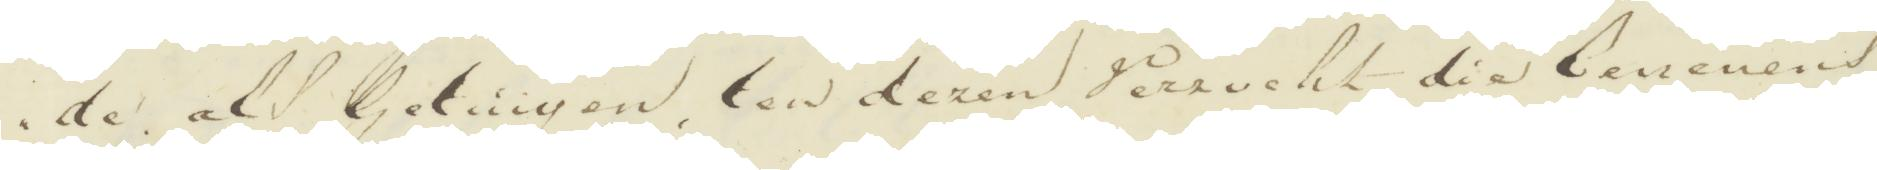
„de, als Getuigen, ten dezen Verzocht, die benevens
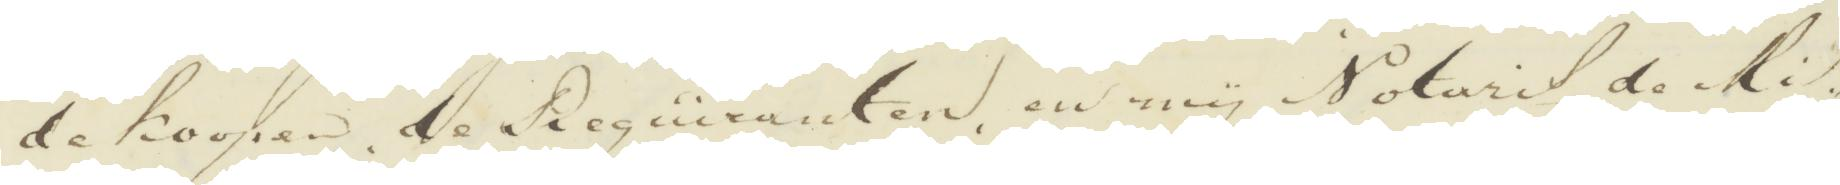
de kooper, de Requiranten, en mij Notaris de Mi„
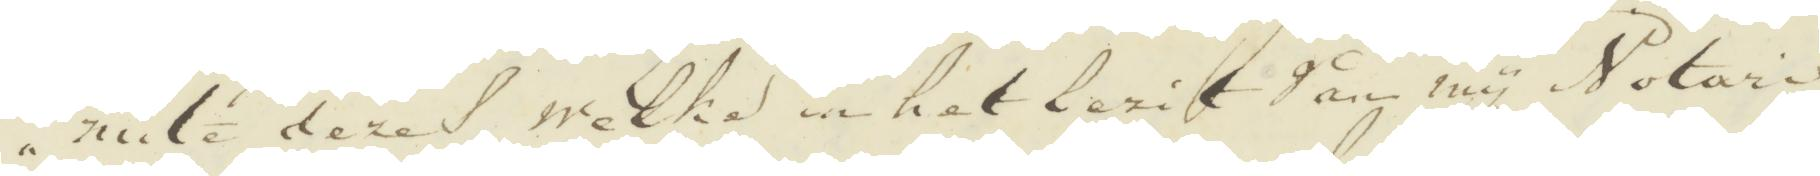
„ nute dezes welke in het bezit van mij Notaris
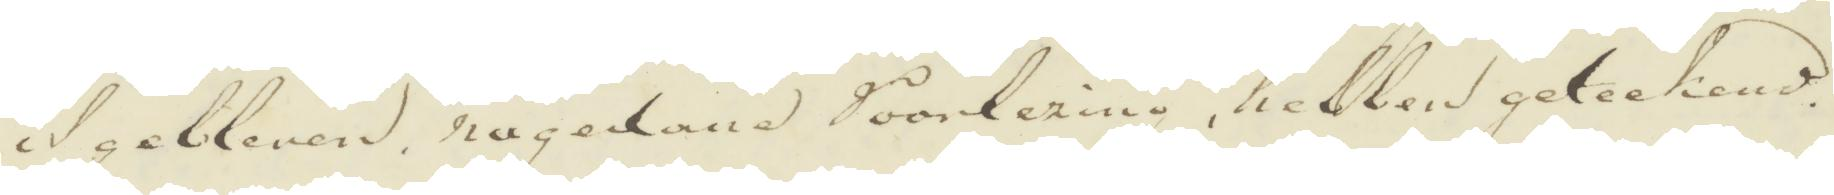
is gebleven, nagedane Voorlezing, hebben geteekend.
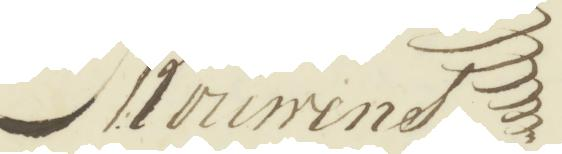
NRouwens
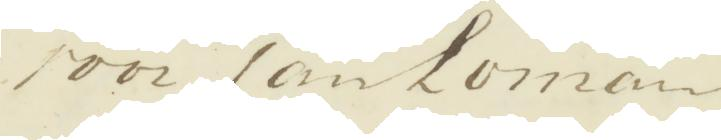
voor Jan Loman
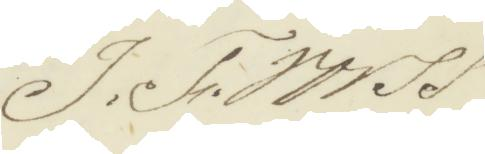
J. F: Vorss
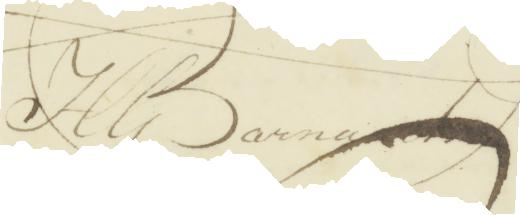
H G. Barnaart
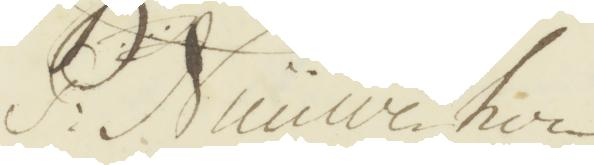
P: Nieuwenhove
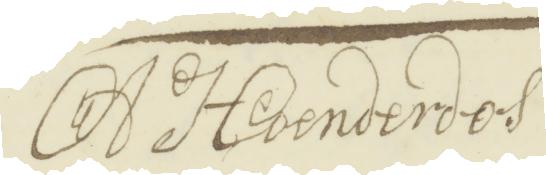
A Hoenderdos
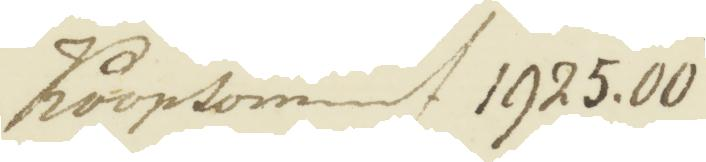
Koopsom ƒ 1925.00
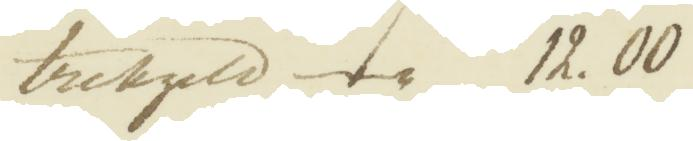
trekgeld —„ 12. 00
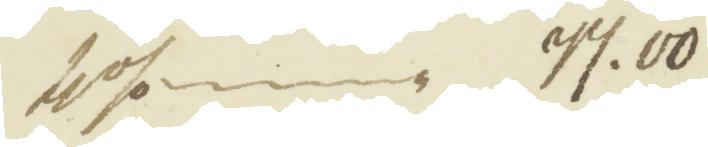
4% —„ 77. 00
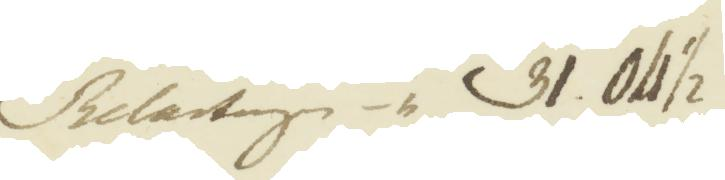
Belastingen -„ 31. 04½
